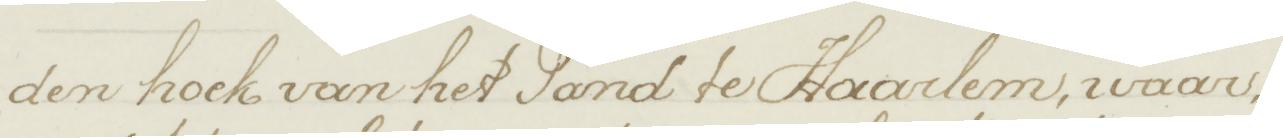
den hoek van het Pand te Haarlem, waar„
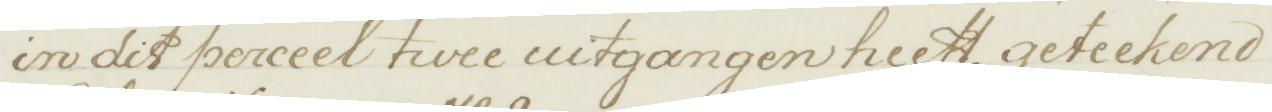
in dit perceel twee uitgangen heeft, geteekend
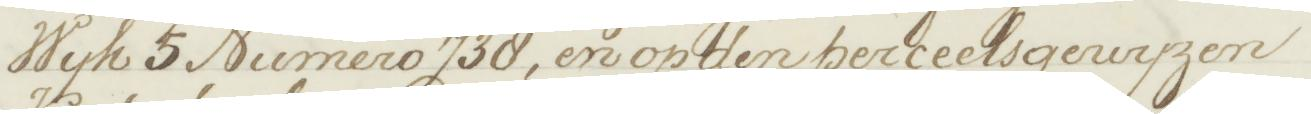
Wyk 5 Numero 738, en op den perceelsgewyzen
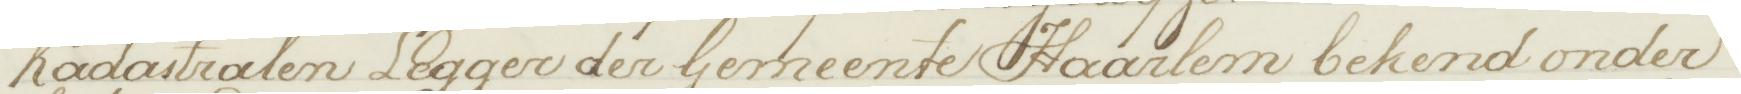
Kadastralen Legger der Gemeente Haarlem bekend onder
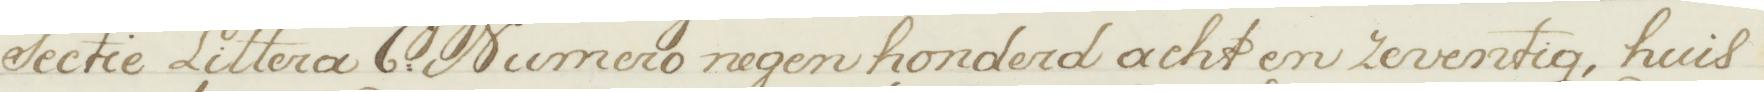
sectie Littera C: Numero negen honderd acht en zeventig, huis
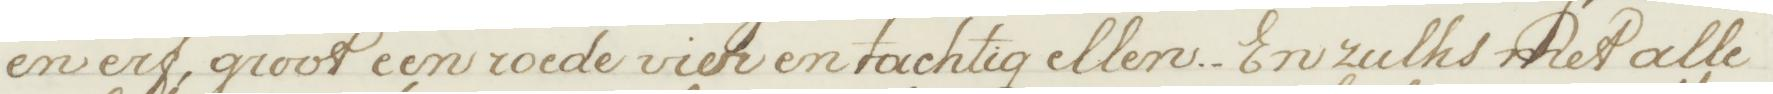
en erf, groot een roede vier en tachtig ellen.- En zulks met alle
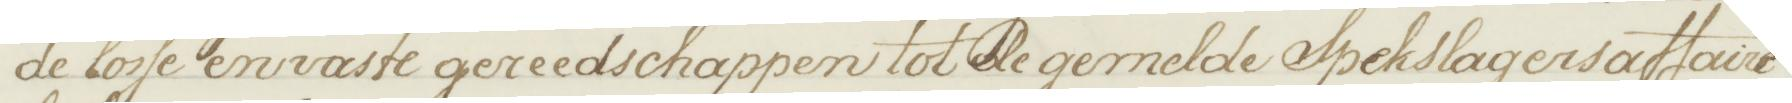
de losse en vaste gereedschappen tot de gemelde Spekslagersaffaire
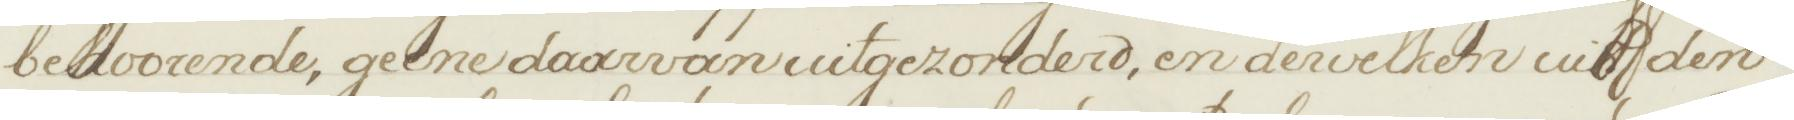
behoorende, geene daarvan uitgezonderd, en dewelken uit den
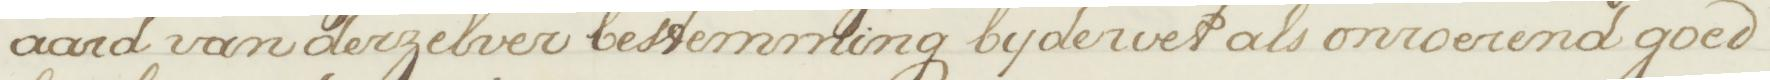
aard van derzelver bestemming by de wet als onroerend goed
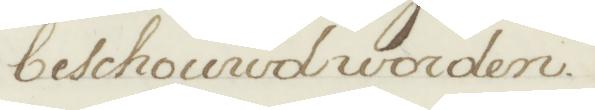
beschouwd worden.
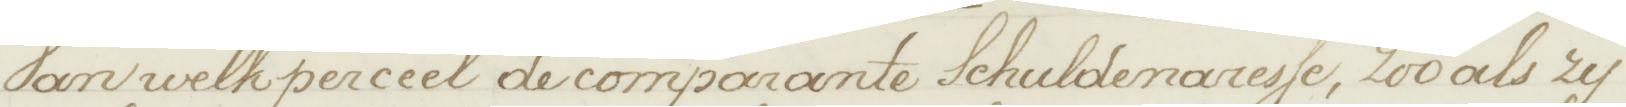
Van welk perceel de comparante Schuldenaresse, zoo als zy
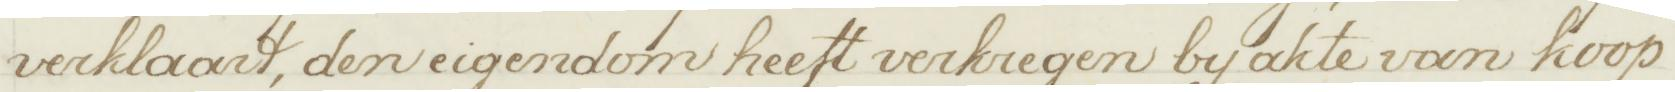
verklaart, den eigendom heeft verkregen by acte van koop
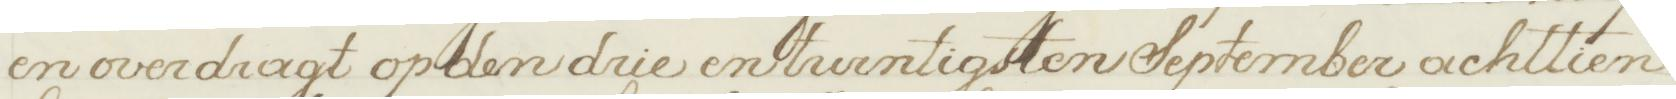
en overdragt op den drie en twintigsten September achttien
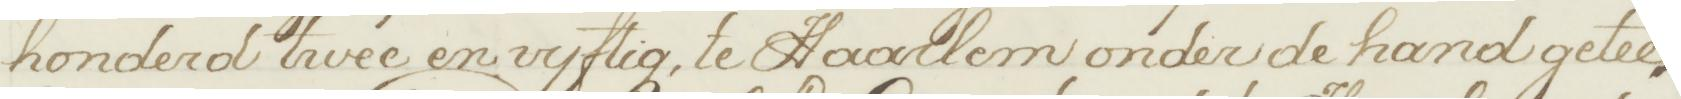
honderd twee en vyftig, te Haarlem onder de hand getee„
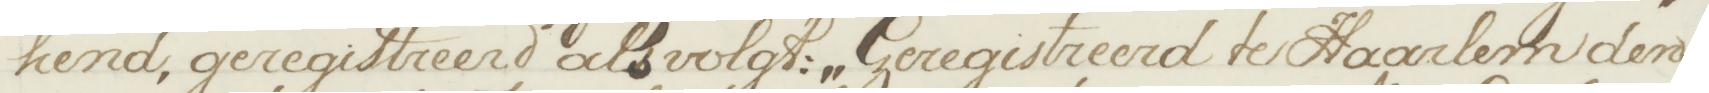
kend, geregistreerd als volgt:„ Geregistreerd te Haarlem den
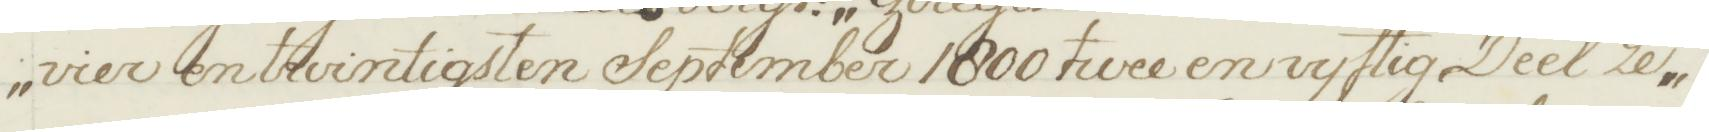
„vier en twintigsten September 1800 twee en vyftig Deel ze„
